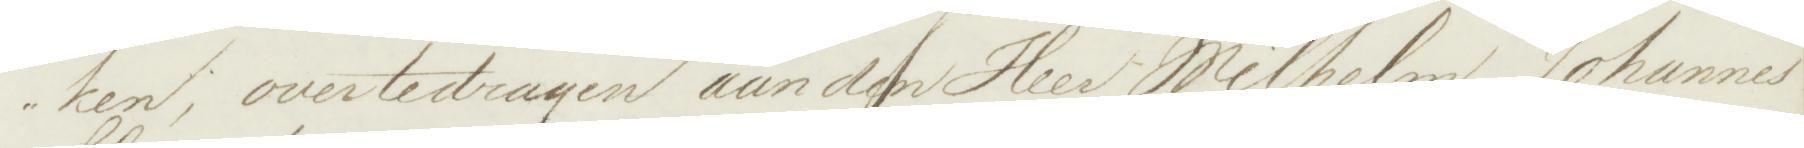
„ ken; overtedragen aan den Heer Wilhelm Johannes
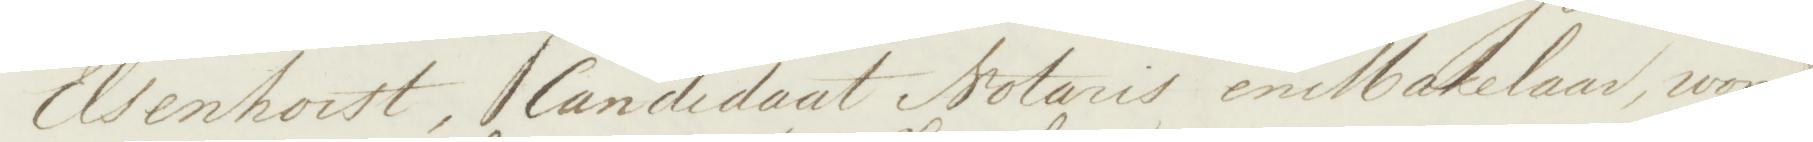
Elsenhorst, Candidaat Notaris en Makelaar, wonen
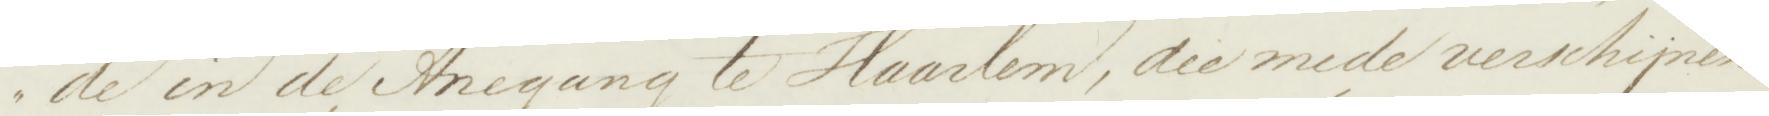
„ de in de Anegang te Haarlem, die mede verschijnen
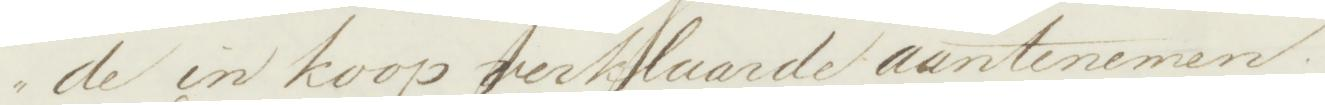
„ de in koop verklaarde aantenemen.
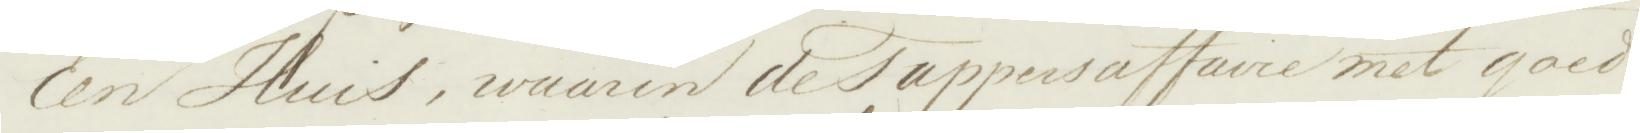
Een Huis, waarin de Tappersaffaire met goed
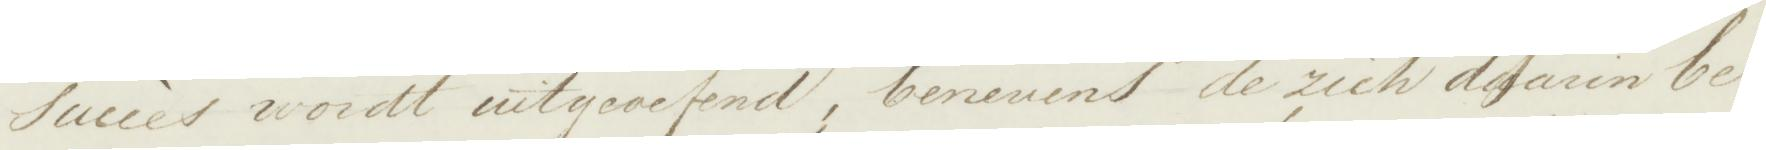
succes wordt uitgeoefend, benevens de zich daarin be
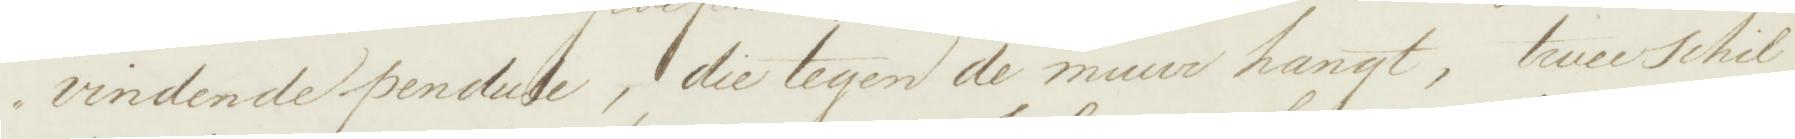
„ vindende pendule, die tegen de muur hangt, twee schil
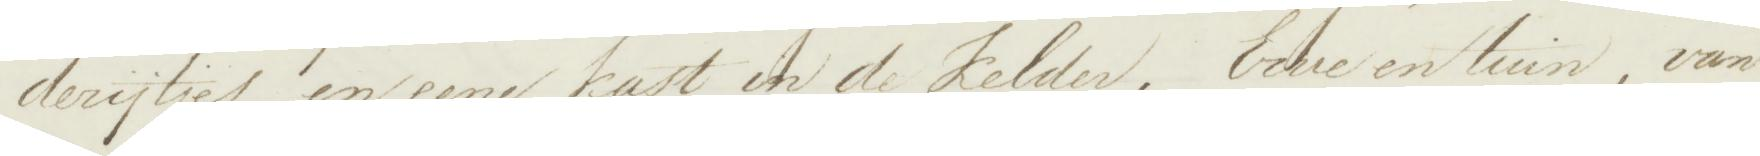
derijtjes en eene kast in de Kelder, Erve en tuin, van
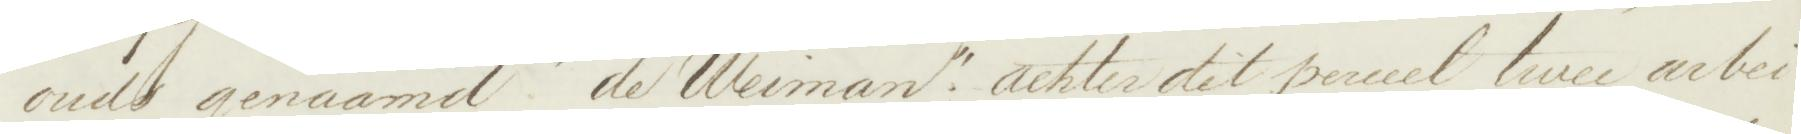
ouds genaamd " de Weiman": achter dit perceel twee arbei
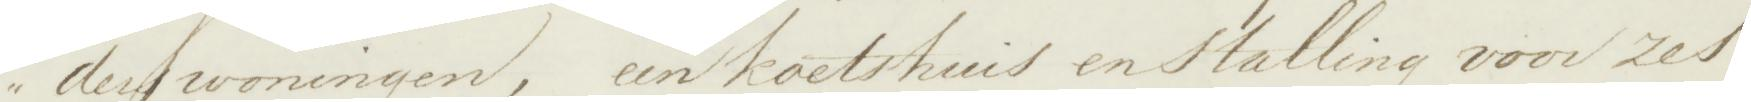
„ der woningen, een koetshuis en stalling voor zes
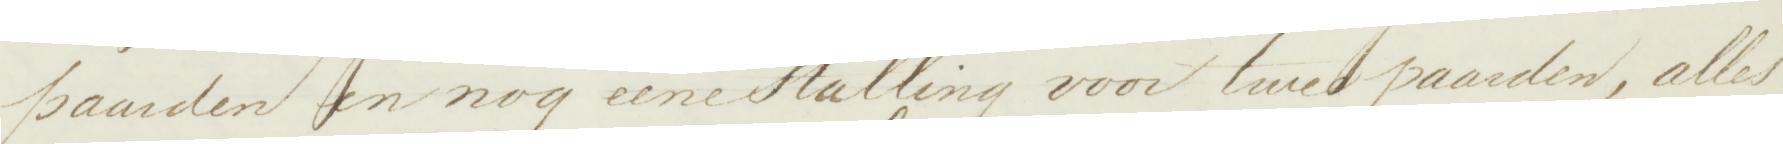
paarden en nog eene stalling voor twee paarden, alles
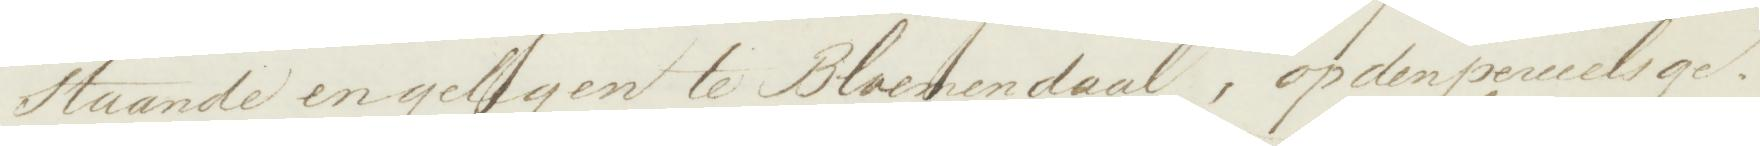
staande en gelegen te Bloemendaal, op den perceels ge„
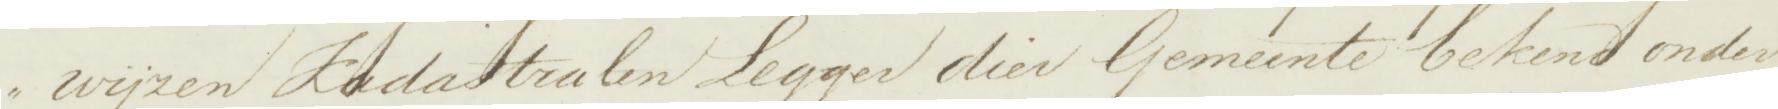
„ wijzen Kadastralen Legger dier Gemeente bekend onder
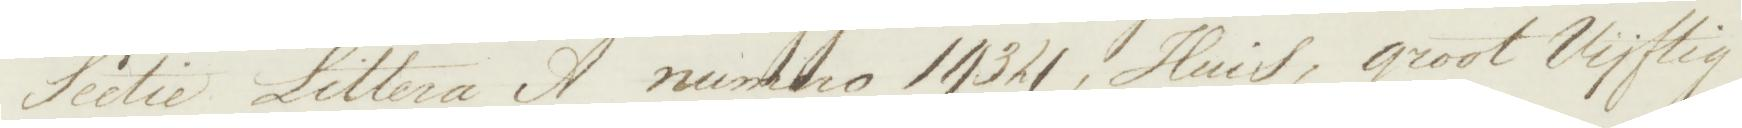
Sectie Littera A numero 1934, Huis, groot Vijftig
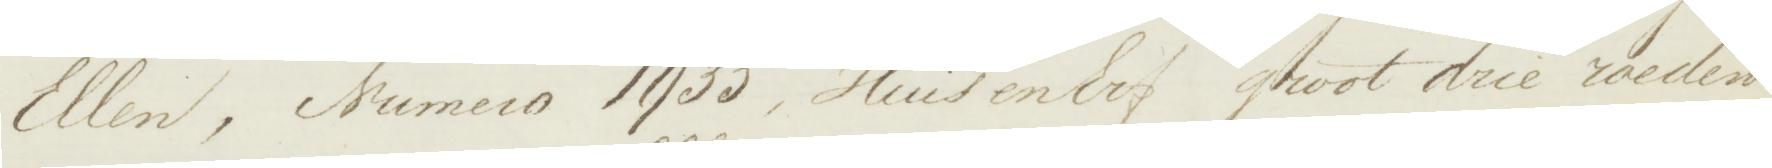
Ellen, Numero 1935, Huis en Erf groot drie roeden
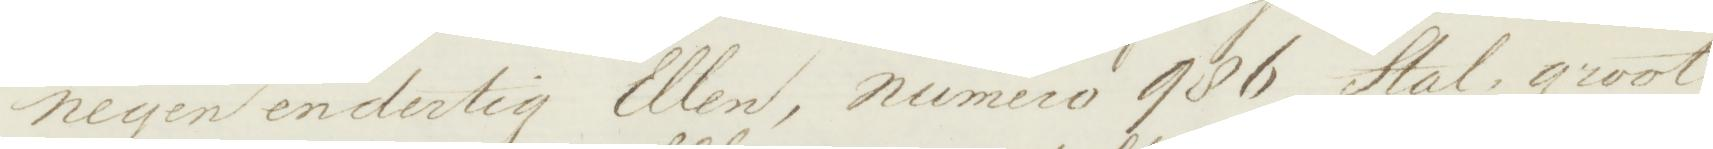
negen endertig Ellen, numero 986 Stal, groot
